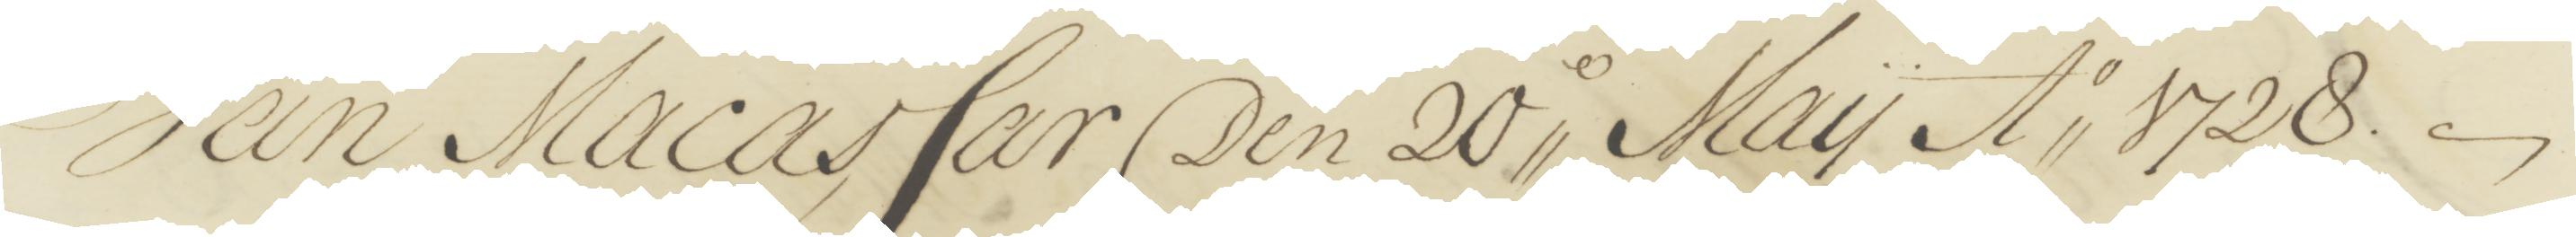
Van Macassar Den 20„e Maij A„o 1728. —
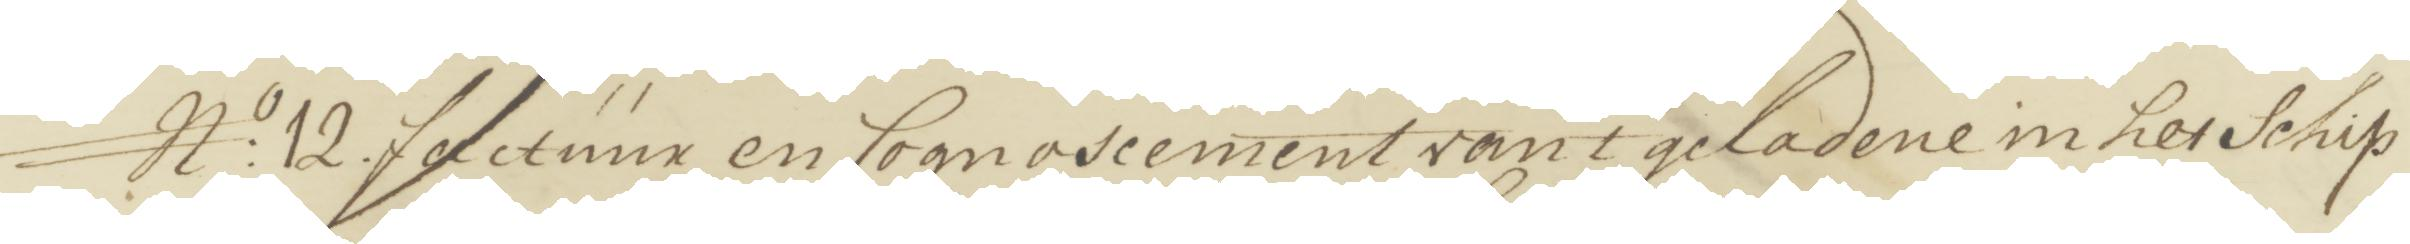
N:o 12. factuur en Cognoscement van ’t geladene in het schip
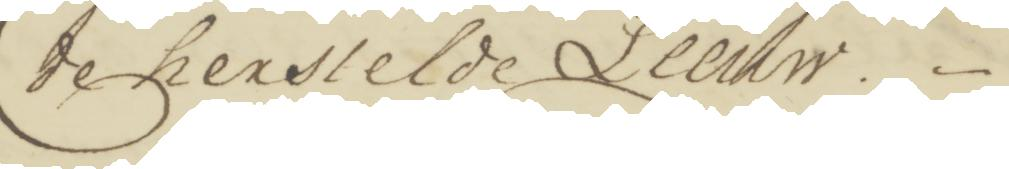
de herstelde Leeuw. —
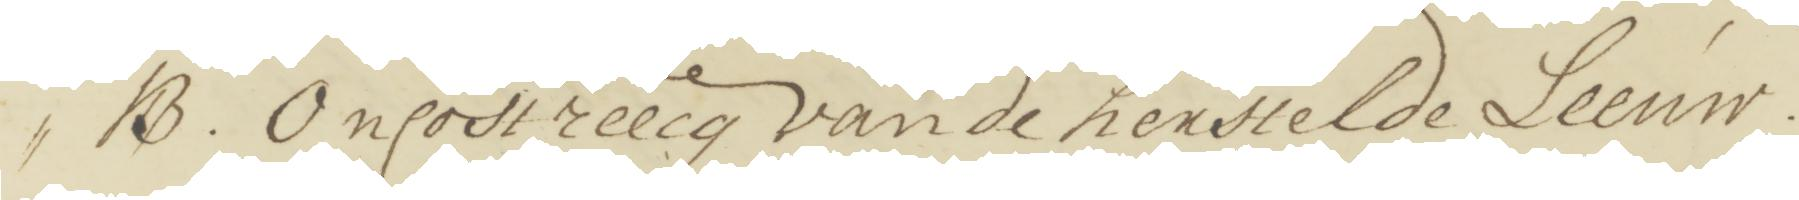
„ 13. Oncost reecq van de herstelde Leeuw
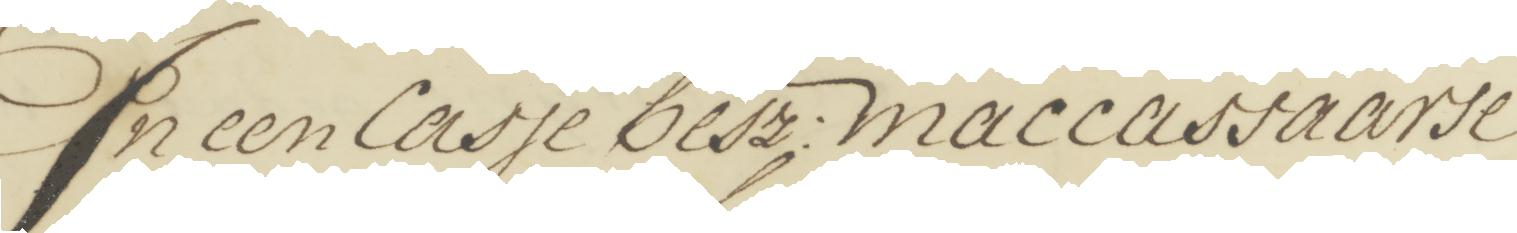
Jn een Casje besz: maccassaarse
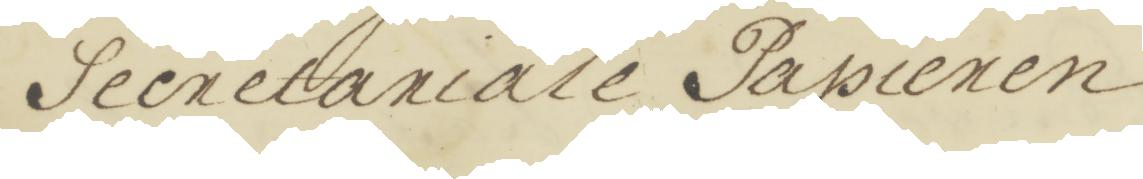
secretariale Papieren
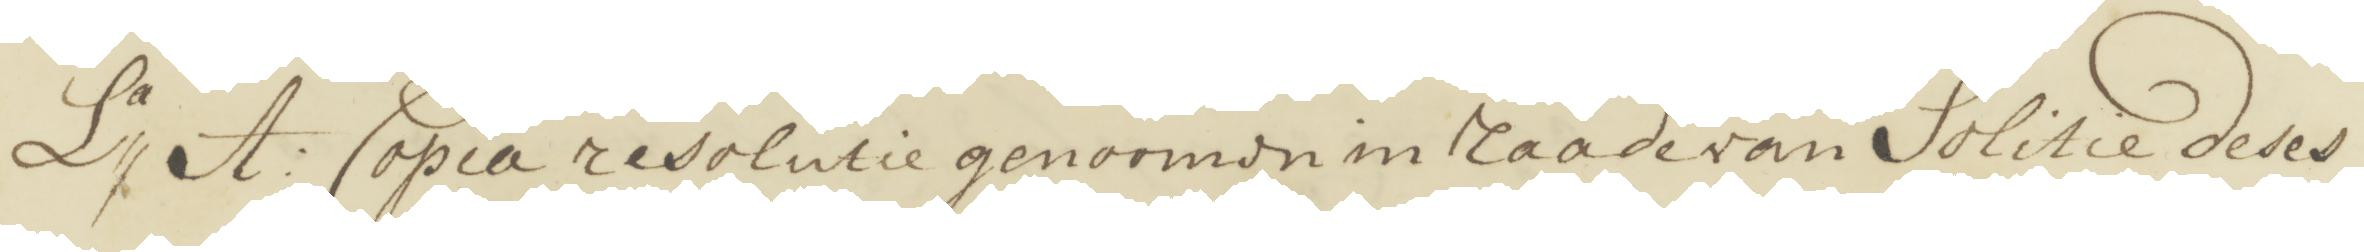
L„a A: Copia resolutie genoomen in raade van Politie deses
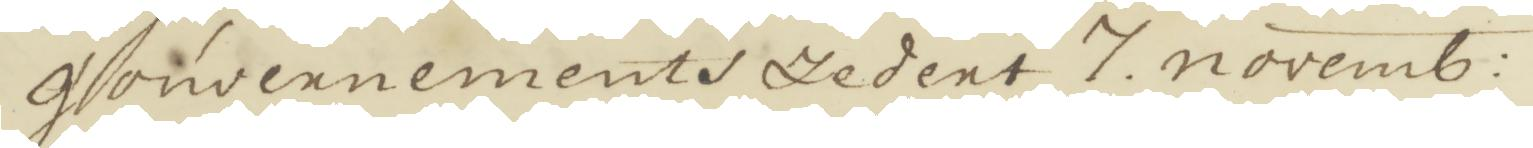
gouvernements zedert 7. novemb:
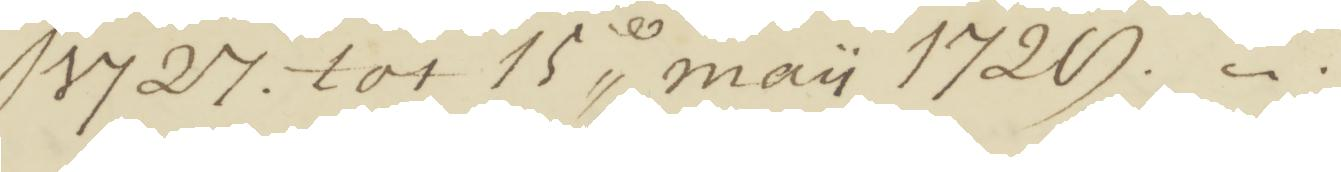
1727. tot 15„e maij 1728. —
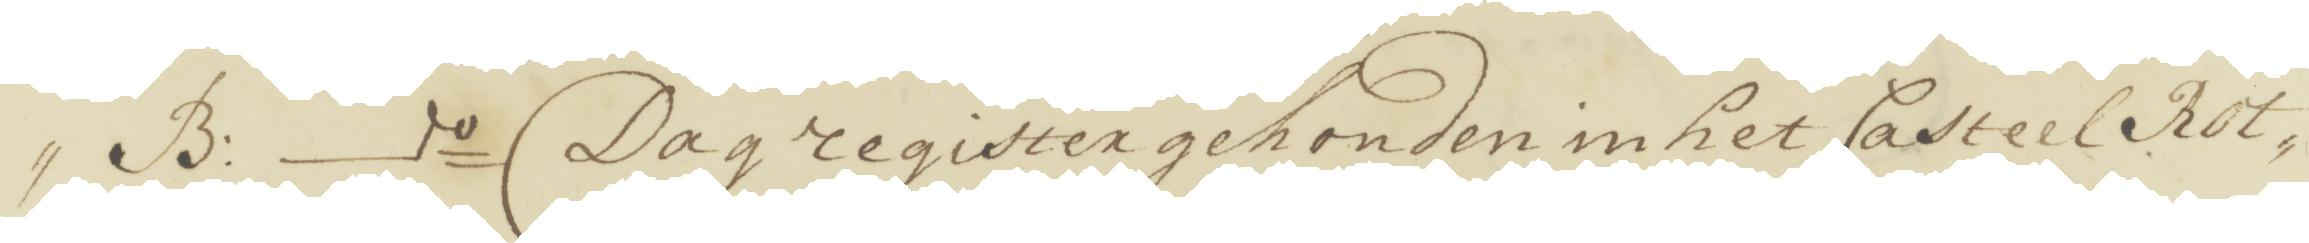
„ B: _=o Dag register gehouden in het Casteel Rot„
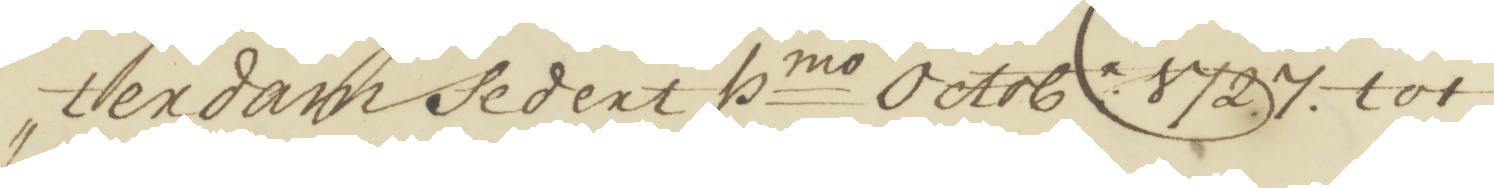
„terdam sedert p=mo Octob:r 1727. tot
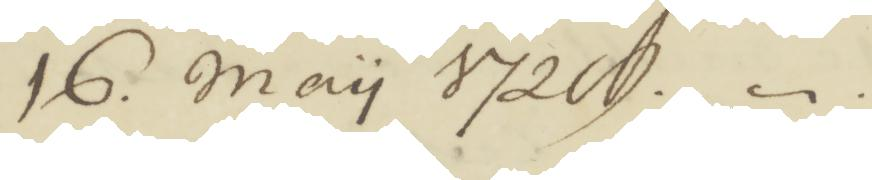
16. Maij 1728. —
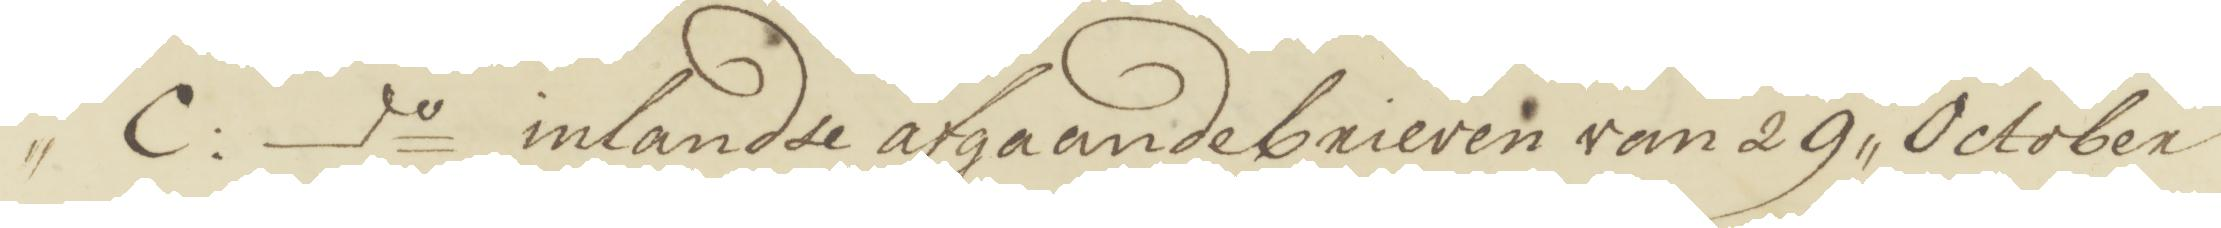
„ C: _=o inlandse afgaande brieven van 29„e October
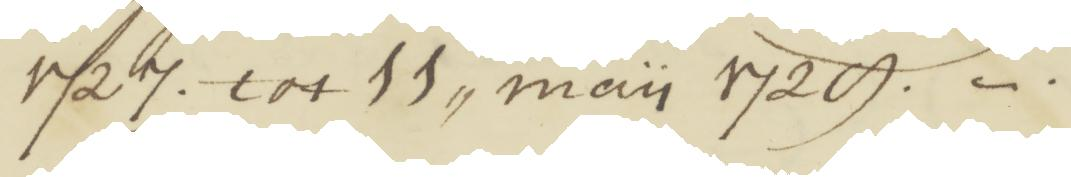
1727. tot 11„e maij 1728. — .
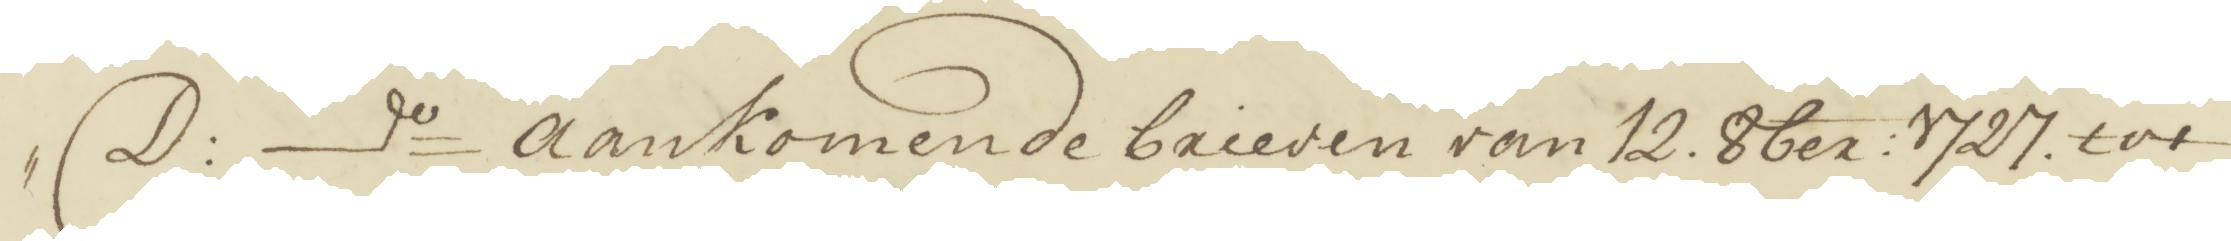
„ D: _=o aankomende brieven van 12. 8ber: 1727. tot
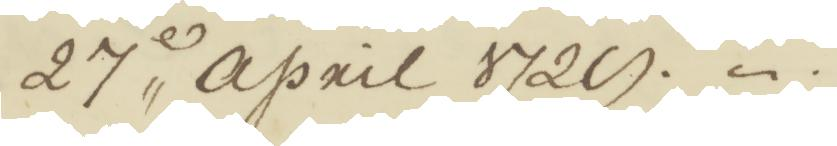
27„e april 1728. — .
